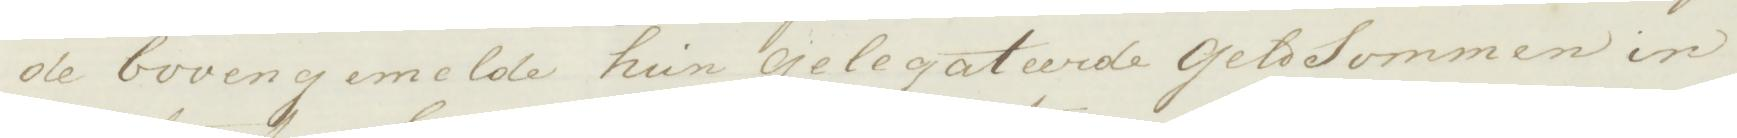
de bovengemelde hun gelegateerde geldsommen in
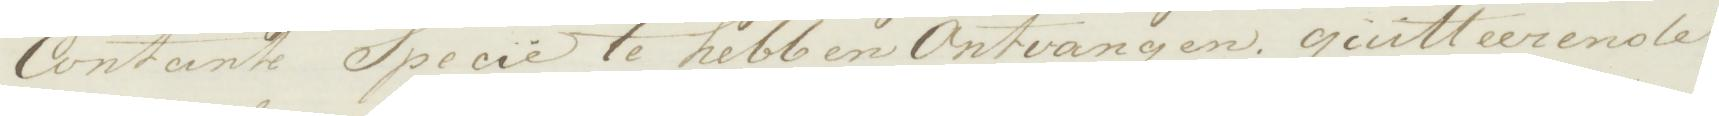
Contante specië te hebben Ontvangen, quitteerende
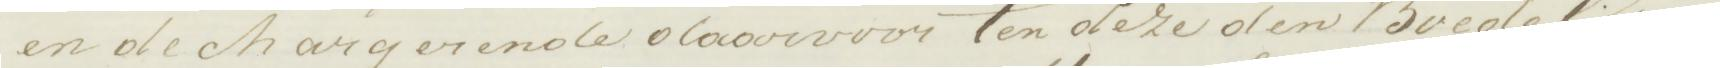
en dechargerende daarvoor ten deze den Boedel en
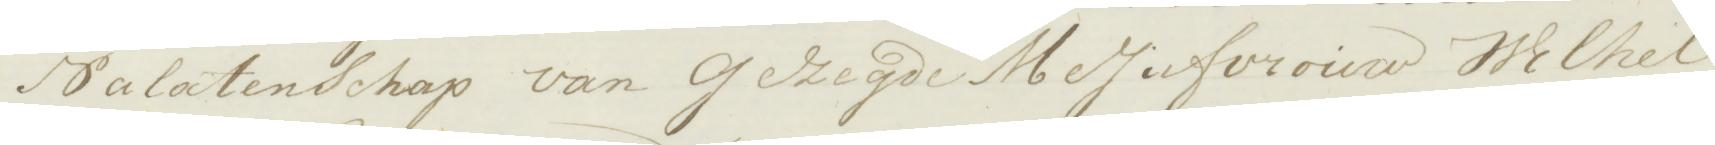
Nalatenschap van Gezegde Mejufvrouw Wilhel
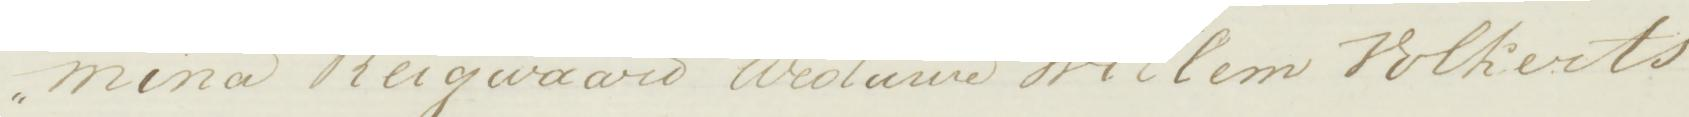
„mina Reigwaard weduwe Wiilem Volkerts
